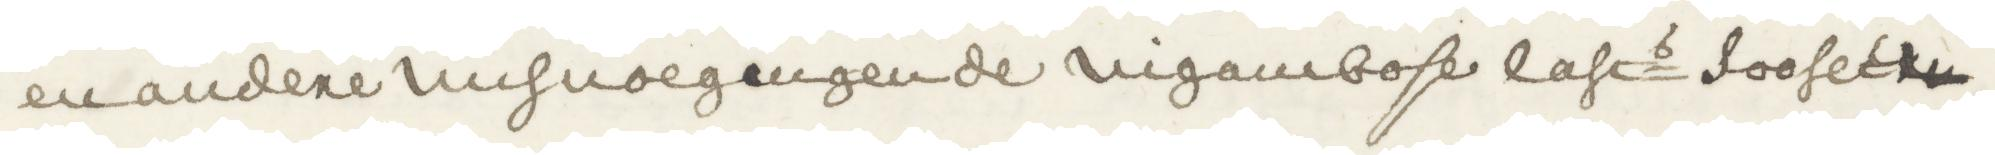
en andere misnoegingen de nigambose lasc=s Soo secre
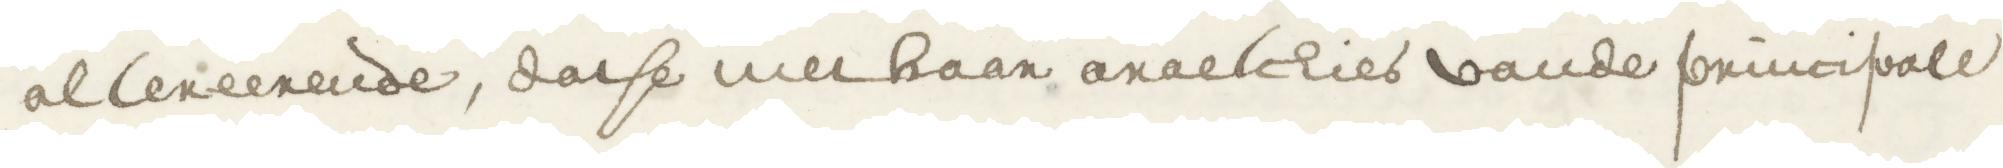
altereerende, datse met haar araltchies vande principale
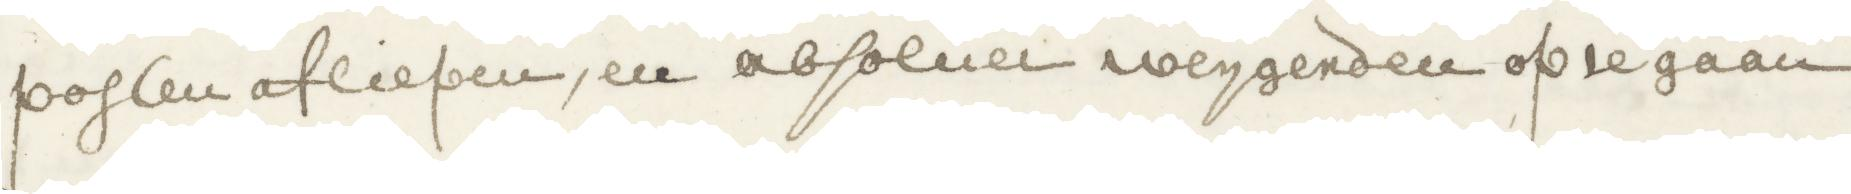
posten afliepen, en absoluet weijgerden op te gaan
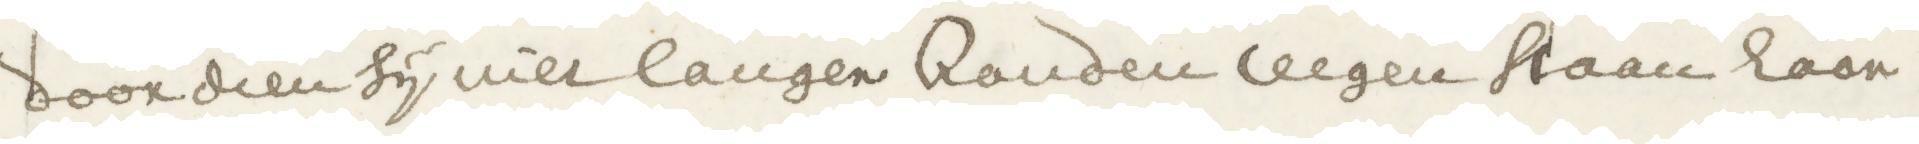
door dien sij niet langer konden teegen staan haar
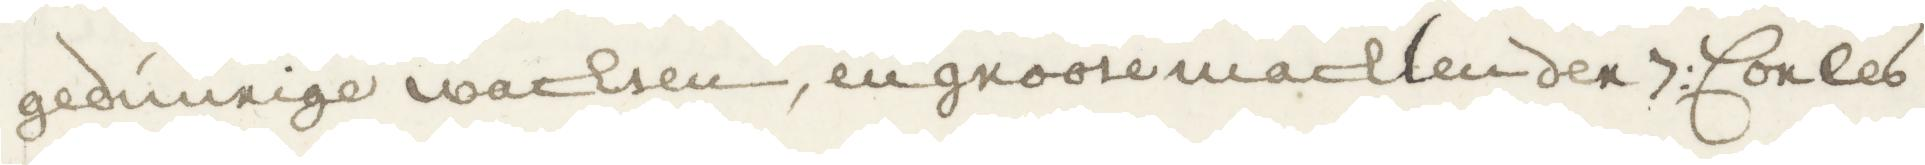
geduurige wachten, en groote machten der 7: Corles
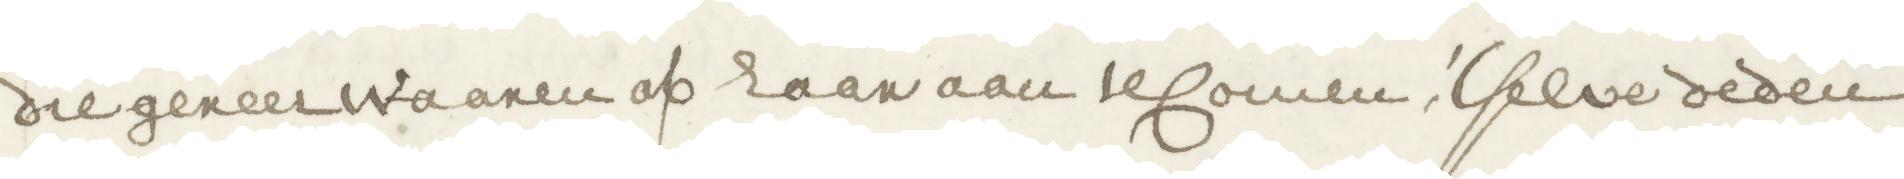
die gereet waaren op haar aan te Comen, 't selve deden
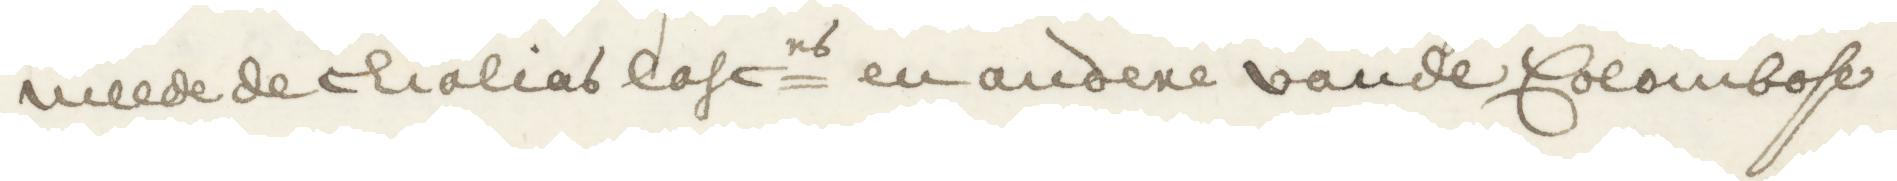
meede de chialias lasc=rs en andere van de Colombose
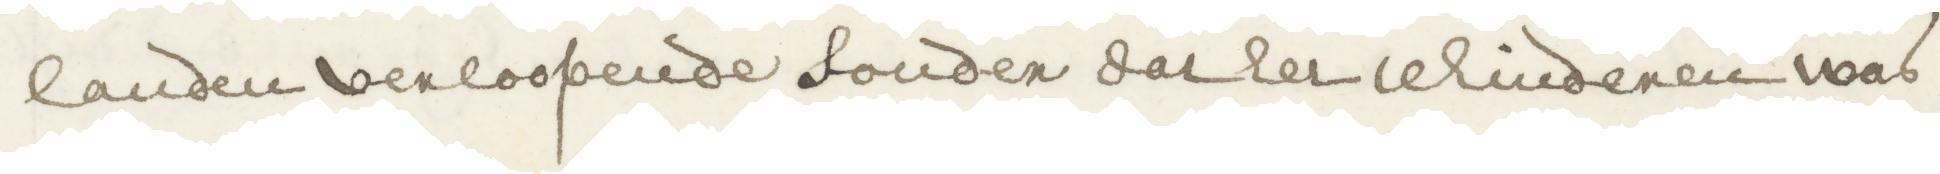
landen verloopende Sonder dat het tehinderen was
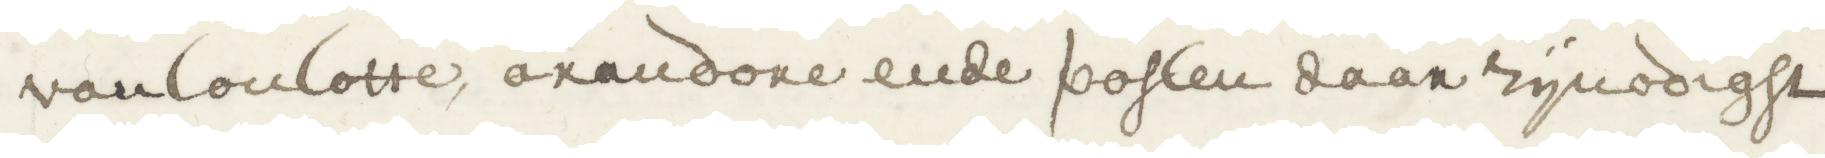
van tontotte, arandore ende posten daar zij nodigst
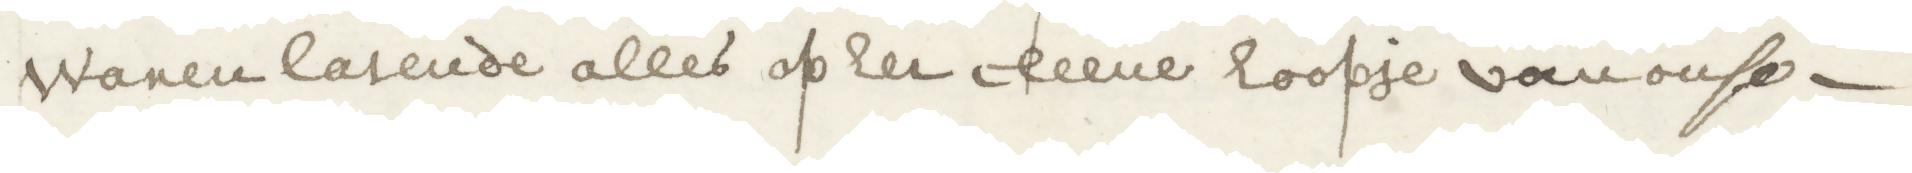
Waren latende alles op het cleene hoopje van onse —
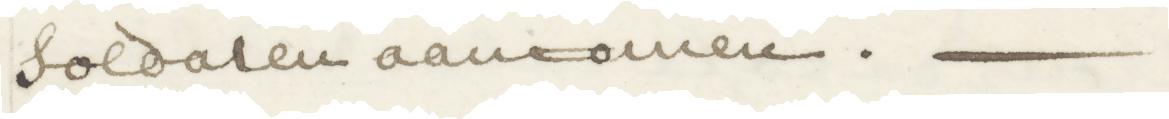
soldaten aancomen. —
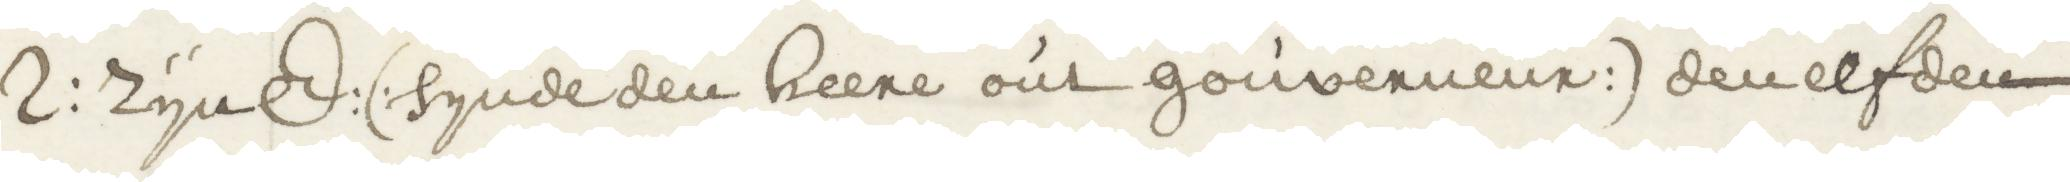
2:en Zijn E: (:sijnde den heere out gouverneur:) den elfden
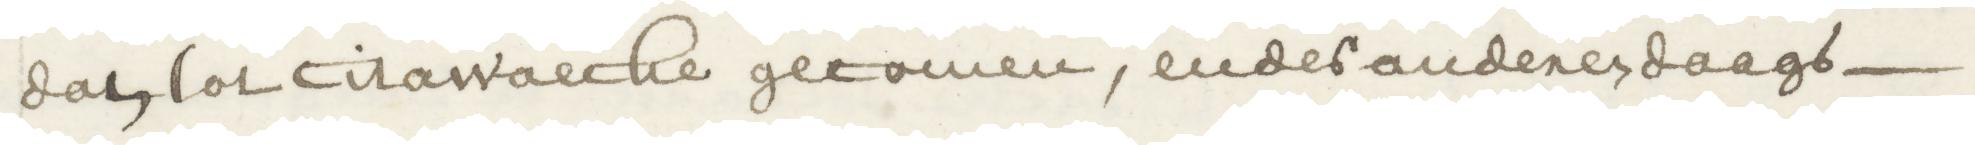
daten tot citawaecke gecomen, en des anderen daags —
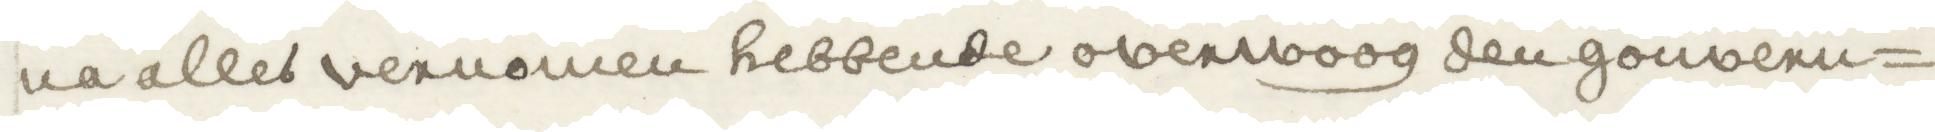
na alles vernomen hebbende overwoog den gouvern=r
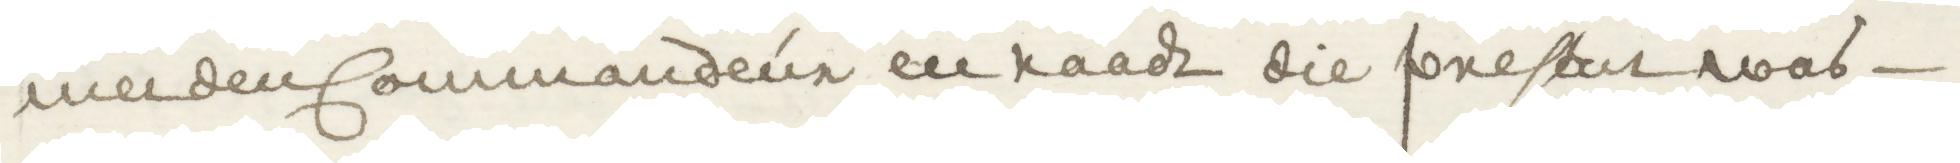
met den Commandeur en raadt die present was —
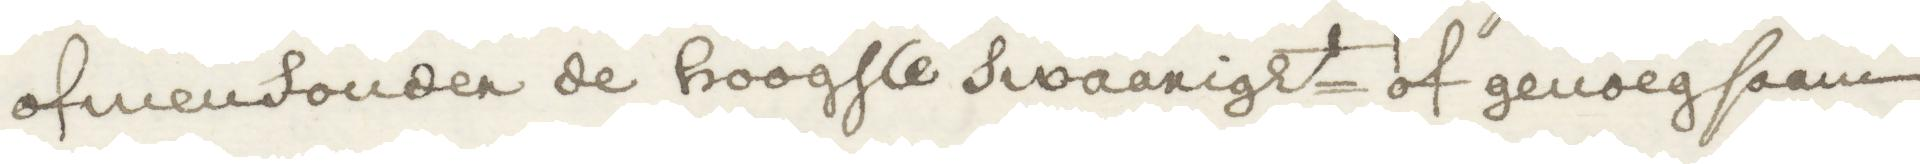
of men sonder de hoogste swaarigh=t of genoegsaam
